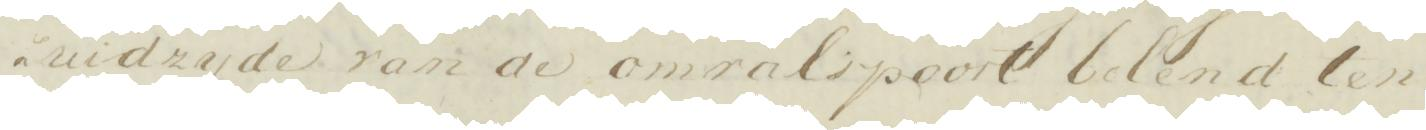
zuidzyde van de omvalspoort belend ten
